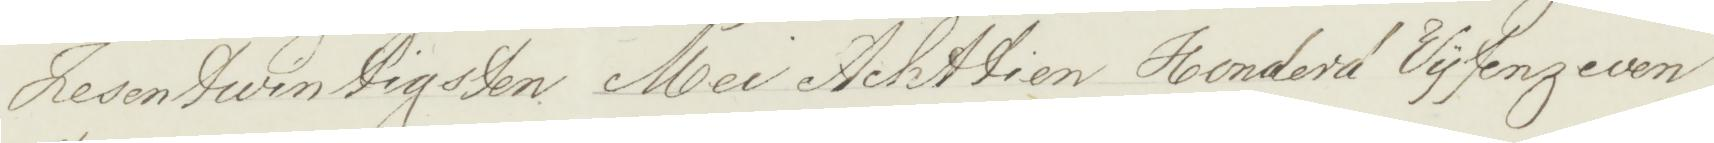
Zesentwintigsten Mei Achttien Honderd Vijfenzeven
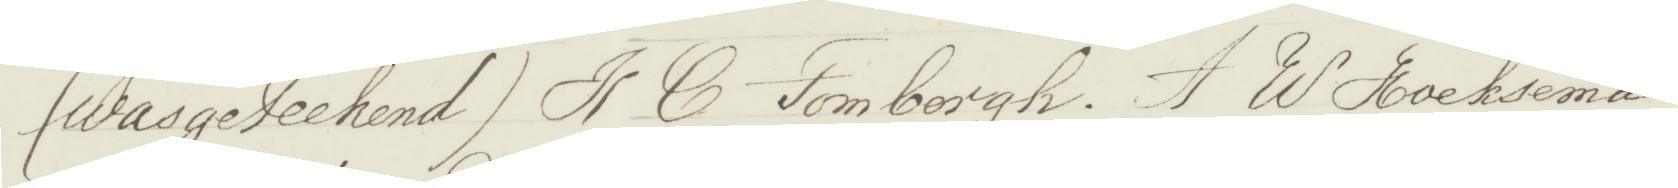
(was geteekend) J C Tombergh. A W Hoeksema
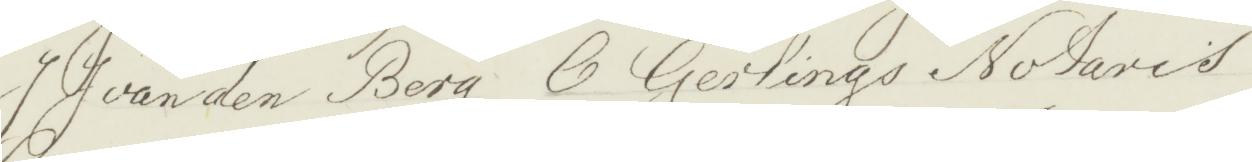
J J van den Berg C Gerlings Notaris
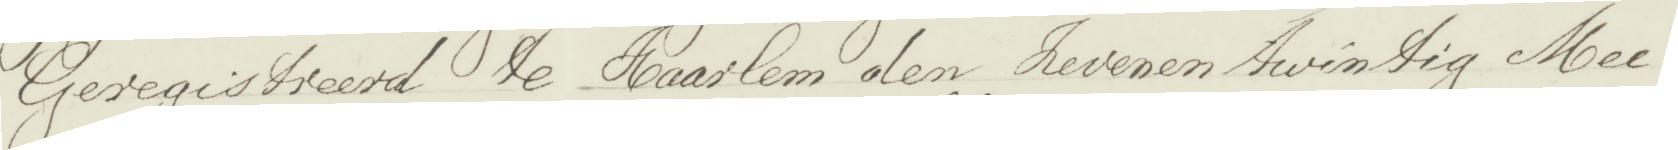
Geregistreerd te Haarlem den Zevenen twintig Mei
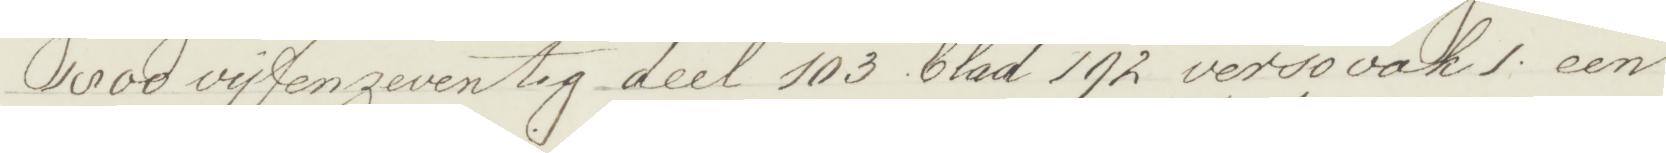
1800 vijfen zeventig deel 103. blad 192 verso vak 1: een
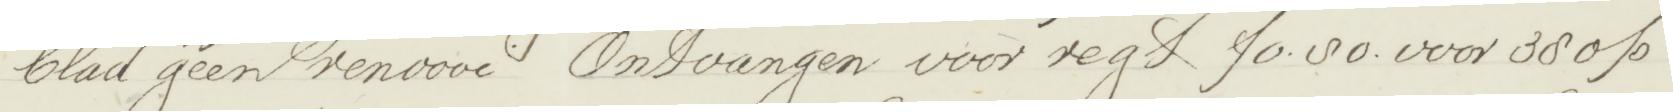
blad geen renvooi Ontvangen voor regt ƒ0. 80. voor 38 op
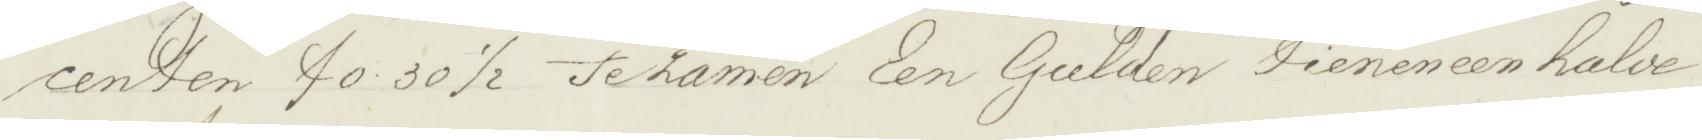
centen ƒ 0. 30½ Tezamen Een Gulden Tienen een halve
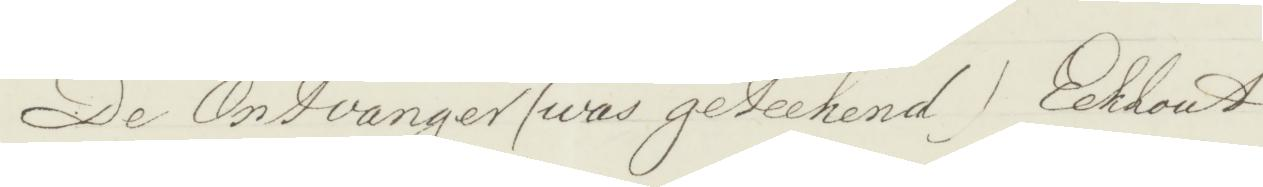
De Ontvanger (was geteekend) Eckhout
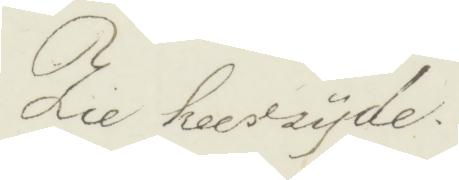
Zie keerzijde.
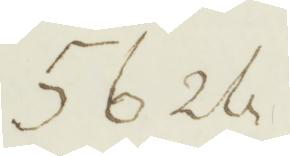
5624
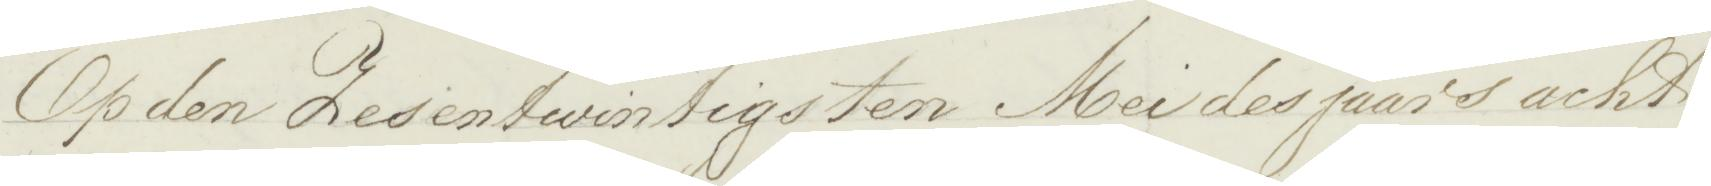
Op den Zesentwintigsten Mei des jaars acht.
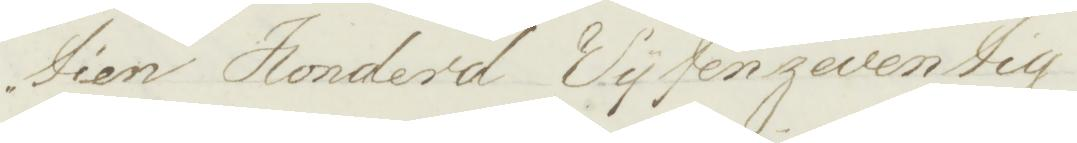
Tien Honderd Vijfenzeventig
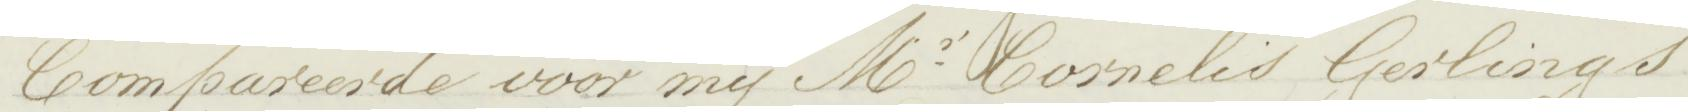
Compareerde voor mij M'r Cornelis Gerlings
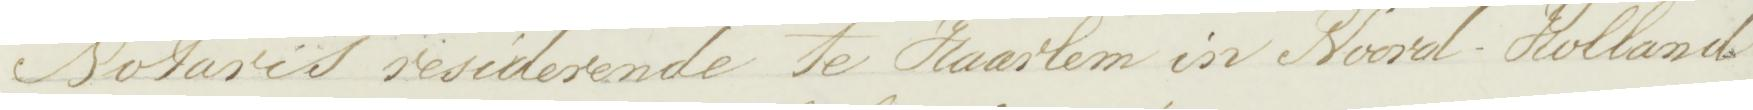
Notaris residerende te Haarlem in Noord - Holland
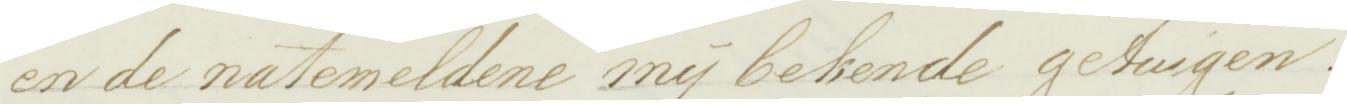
en de natemeldene mij bekende getuigen.
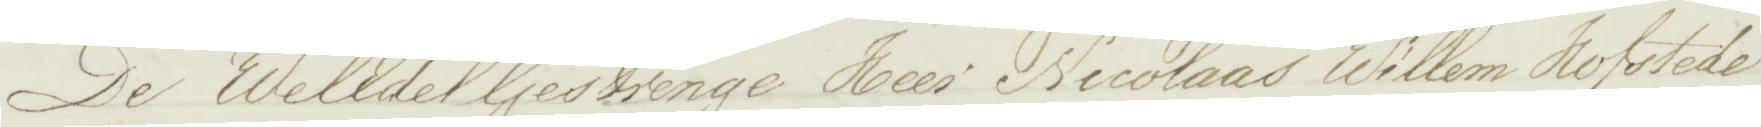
De WelEdel Gestrenge Heer Nicolaas Willem Hofstede
